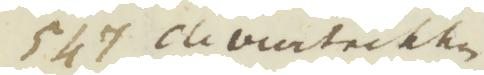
547 di overtrekken
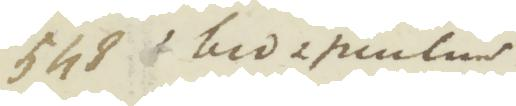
548 1 bed 2 peuluws
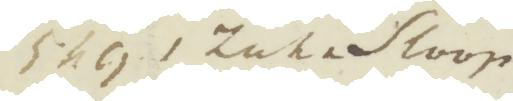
549 1 zak en sloop
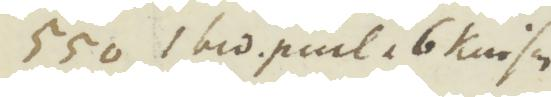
550. 1 bed. peul en 6 kussens.
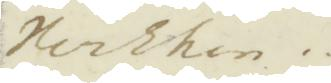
VerEken.
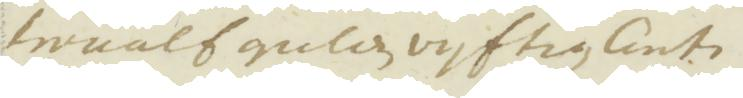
twaalf gulden vyftig Cents
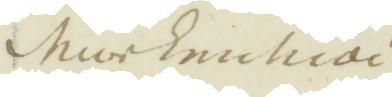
Mevr Enschedé.
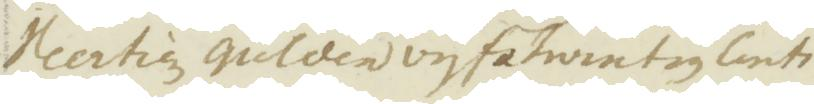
Veertig gulden vyfentwintig Cents
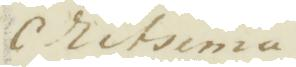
C.Ritsema
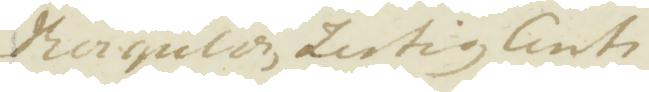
Vier gulden Zestig Cents
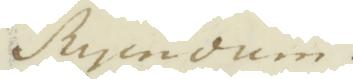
Ryendam.
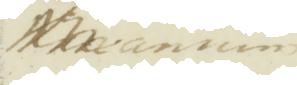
A Wansum
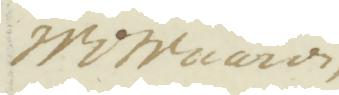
Wvwaaren,
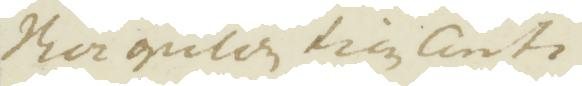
Vier gulden tien Cents
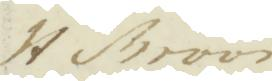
A Broos
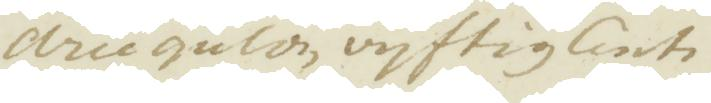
drie gulden vyftig Cents
